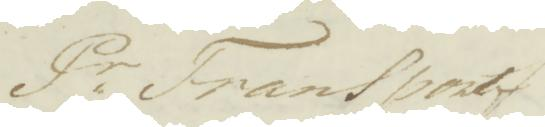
P„r Transport ƒ
